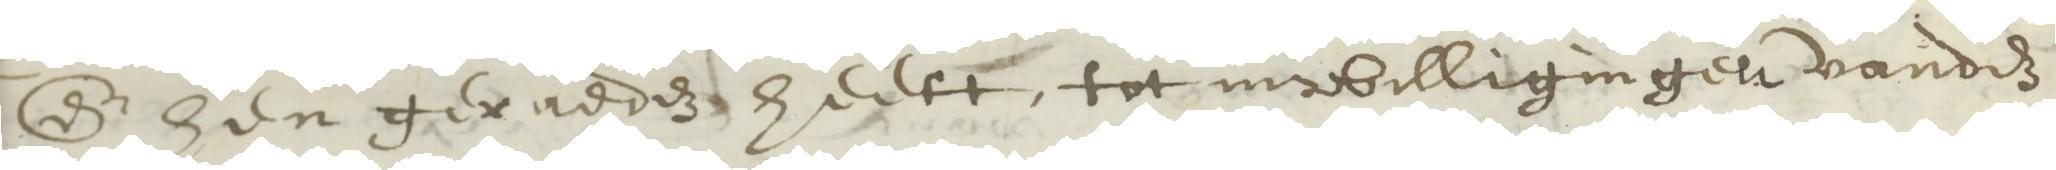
ende hen gerreden heeft, tot inwilligingen vanden
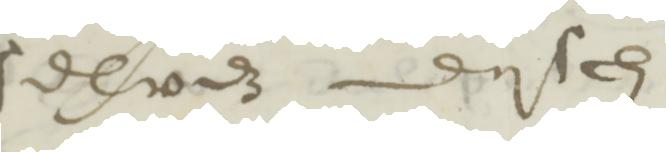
selven Eysch.
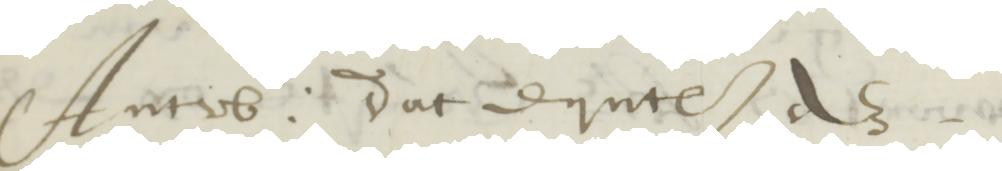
Antw: dat eyntlijk den
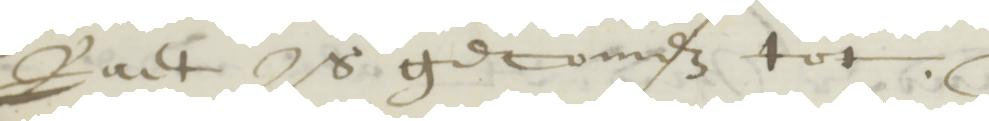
Raet Js gecomen tot
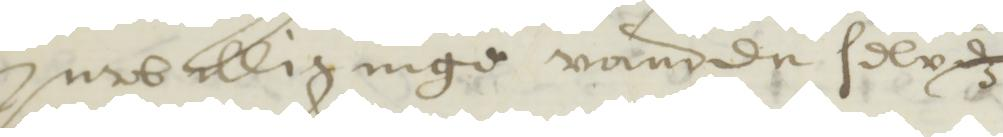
Jnwilliginge vanden selven
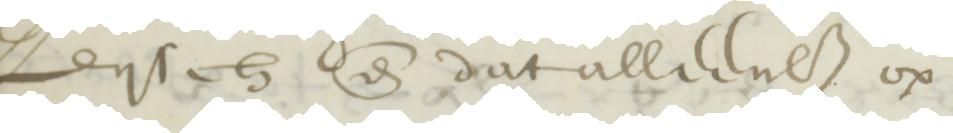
Eysch ende dat alleenlijk op
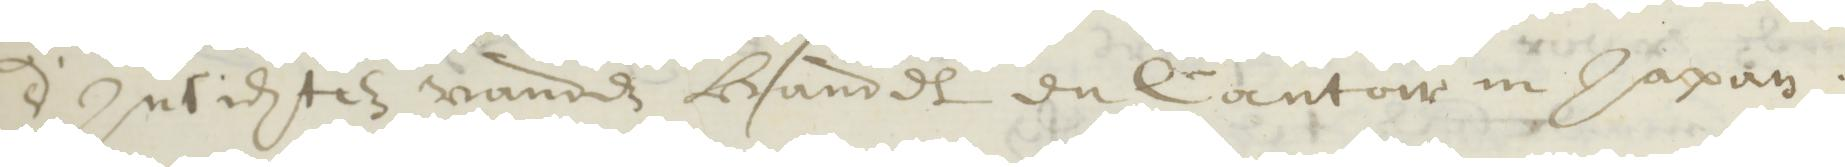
d’ Jnsichten vanden handel en Cantoir in Japan./.
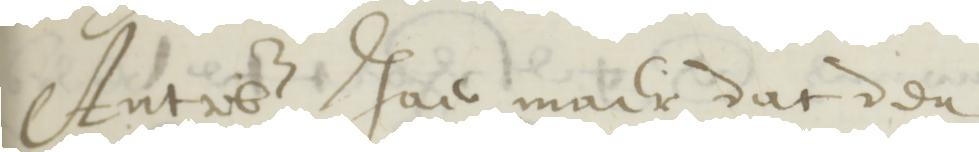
Antw Jae maer dat den
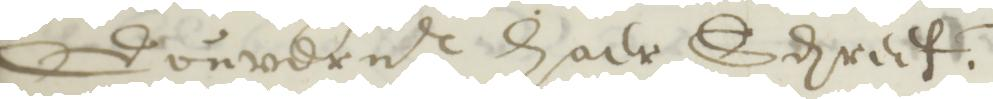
Gouvern=r haer Schreef.
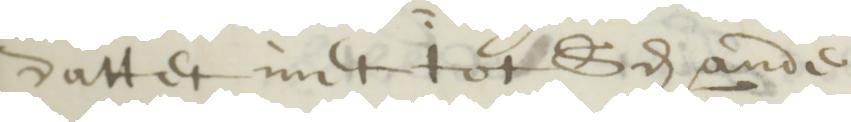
dattet niet tot Schande
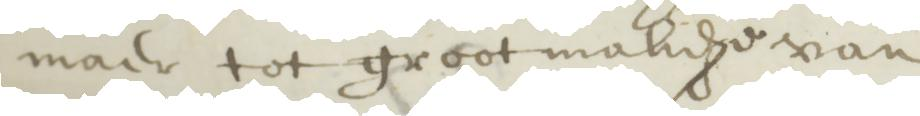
maer tot groot makche van
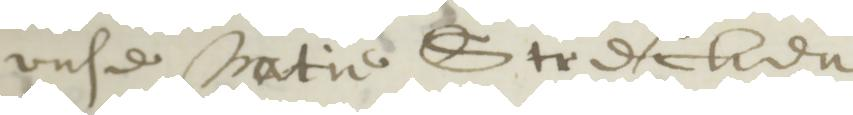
onse Natie Strecken
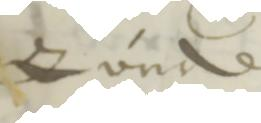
zoude
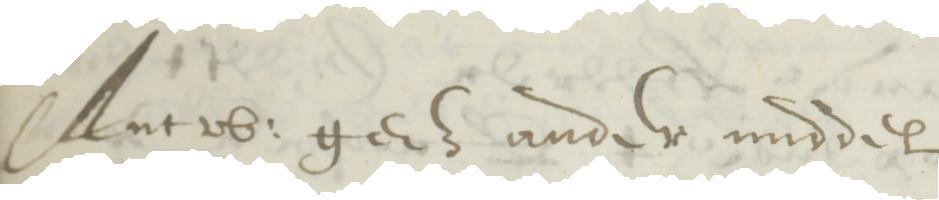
Antw: geen ander middel
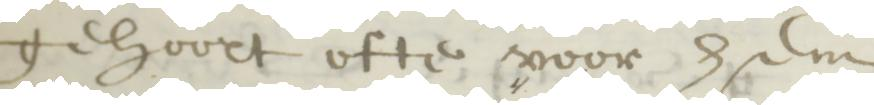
gehoort ofte voor hem
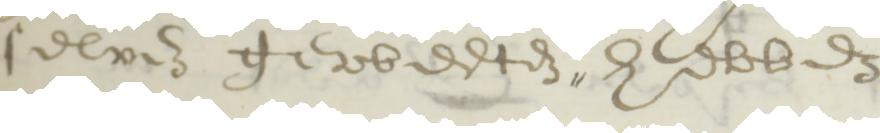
selven geweeten„ hebben
